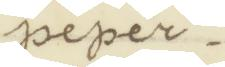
peper -
